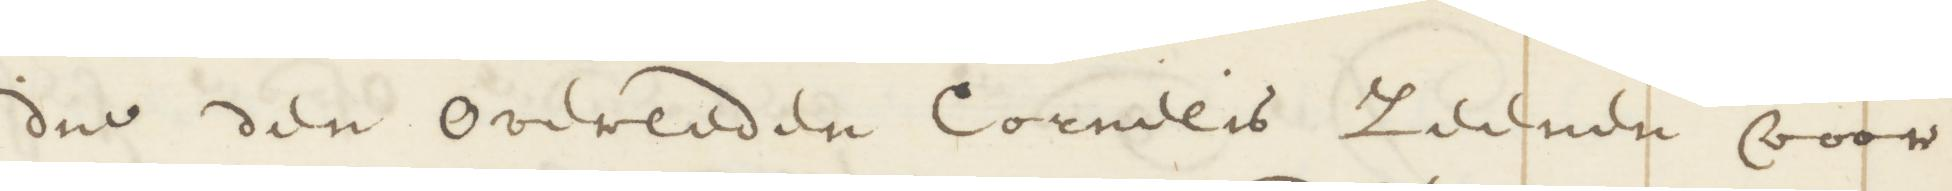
die den overleden Cornelis Zeenen voor
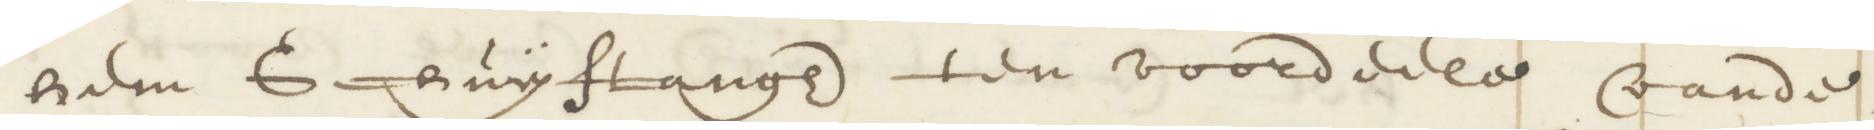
hem Schuijftangh ten voordeele vande
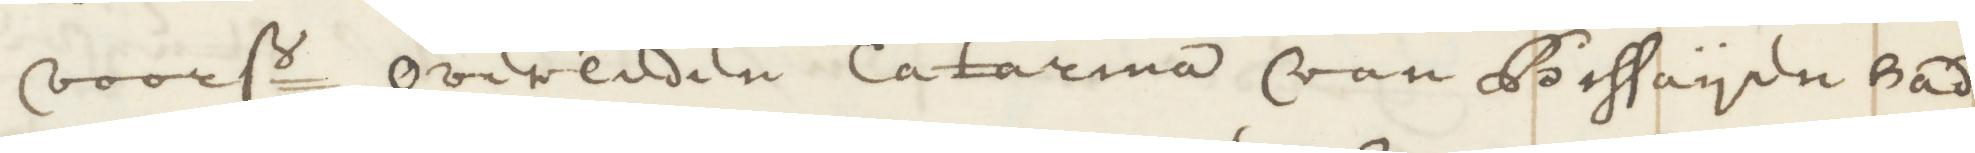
voors=z overleden Catarina van Bissaijen had
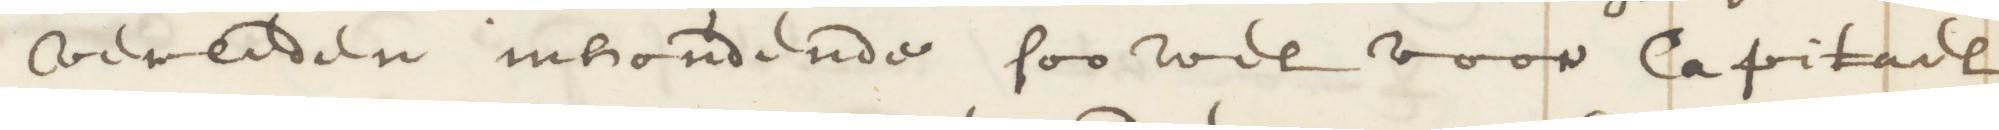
verleden inhoudende soo wel voor Capitael
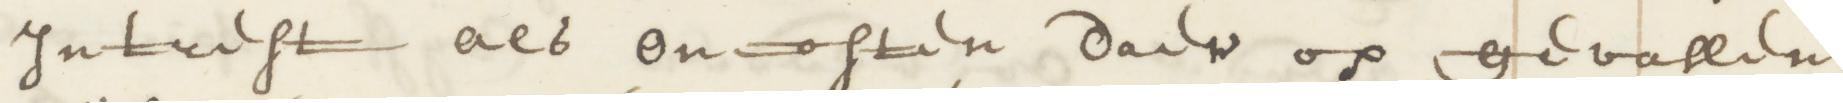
Jntrest als oncosten daer op gevallen
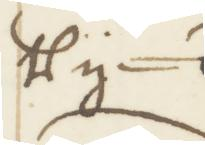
Rijc
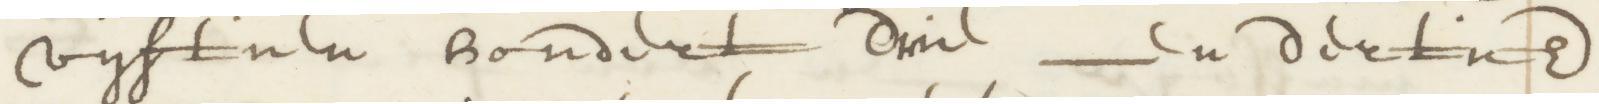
vijftien hondert drie en dertich
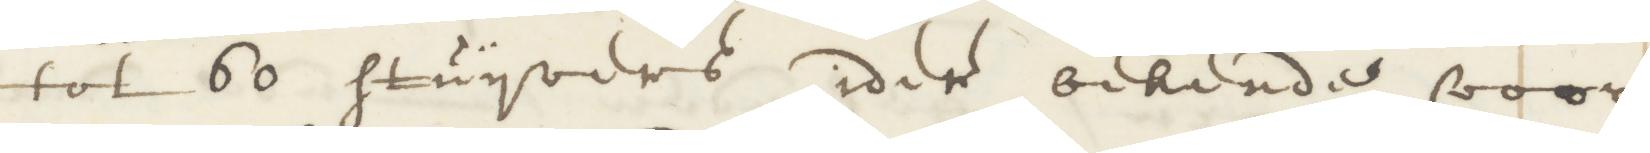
tot 60 stuijvers ider bekende voor
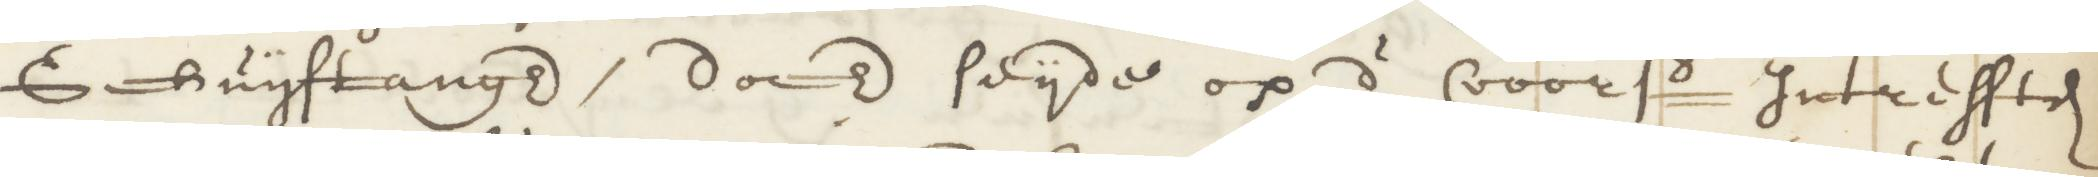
Schuijftangh, doch seijde op d’ voors=z Jntressten
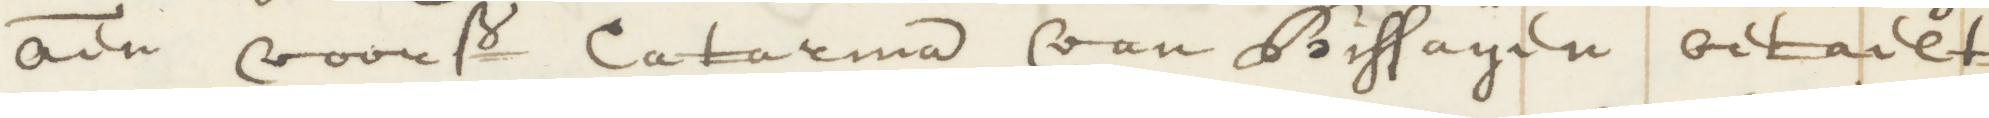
aen voorsz Catarina van Bissaijen betaelt
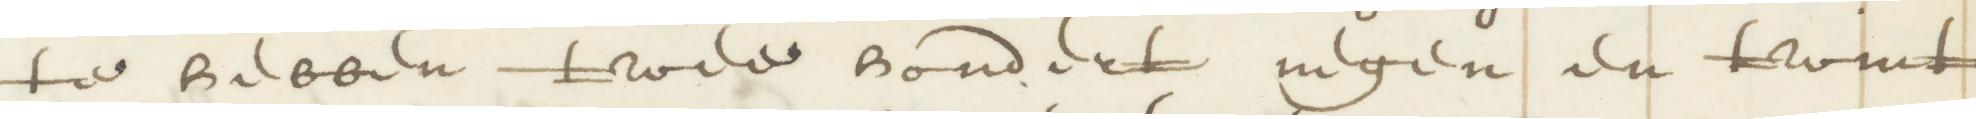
te hebben twee hondert negen en twint
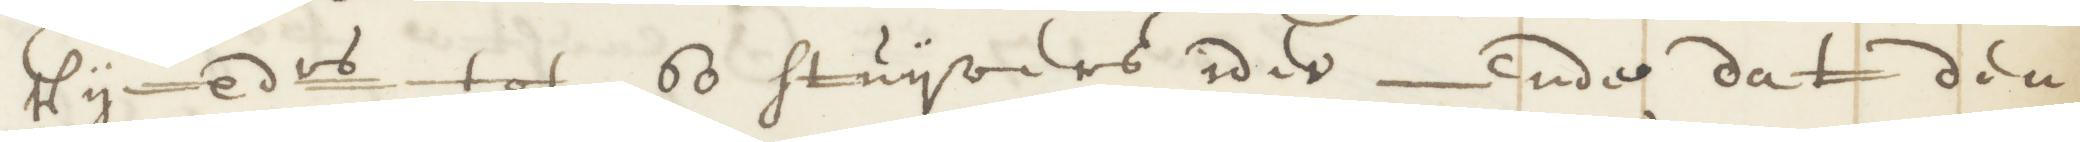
Rijcxd=rs tot 68 stuijvers ider ende dat den
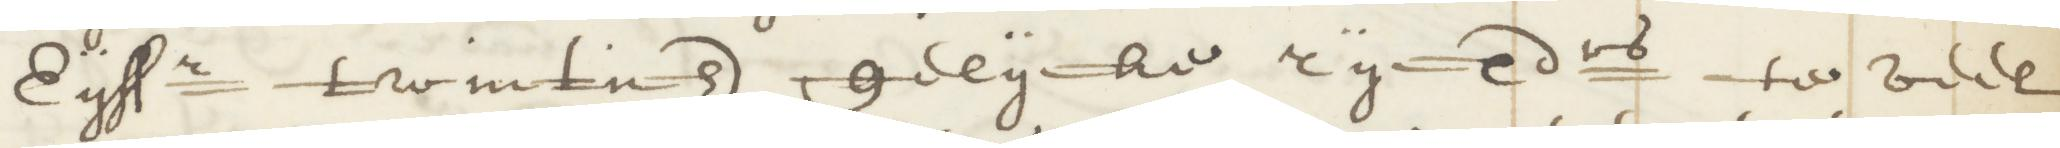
Eyss=r twintich gelijcke rijcxd=rs te veel
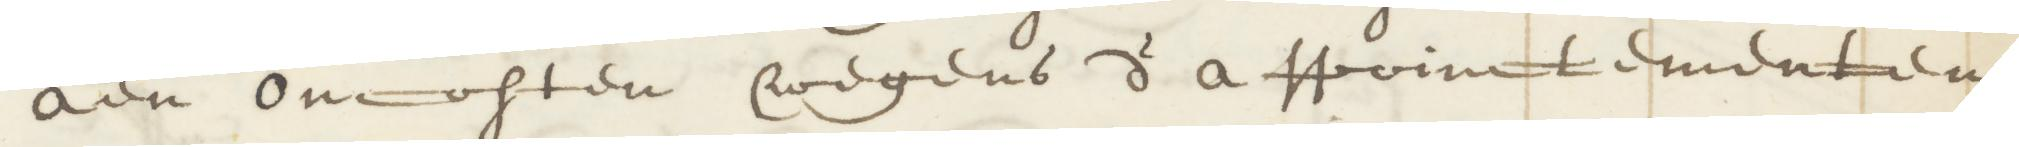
aen oncosten wegens d’ a ppoinctementen
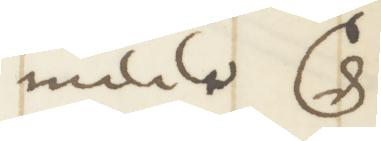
meer ende
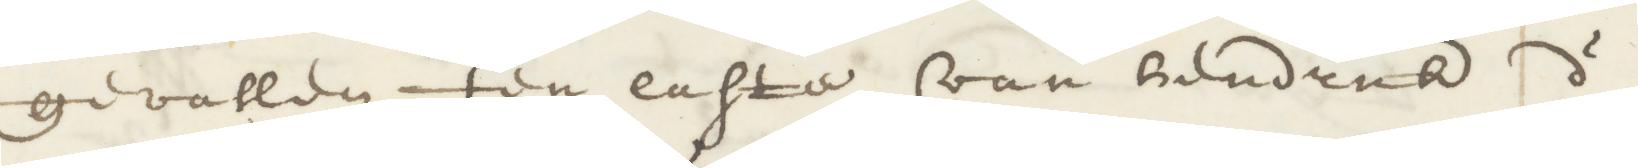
gevallen ten laste van hendrick d'
